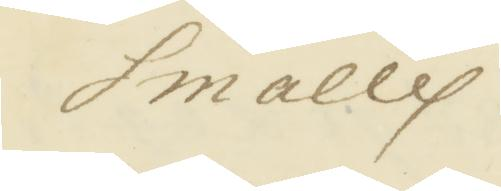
Smalle
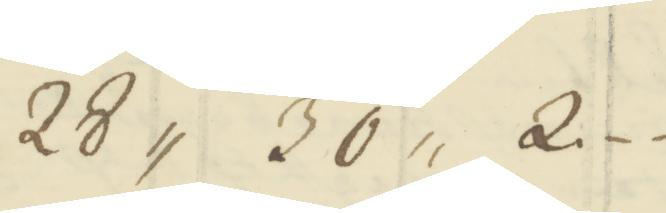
28 „ 30 „ 2.-.
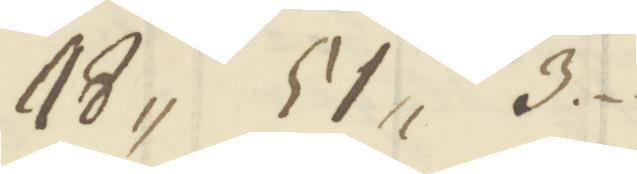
48„ 51„ 3.-
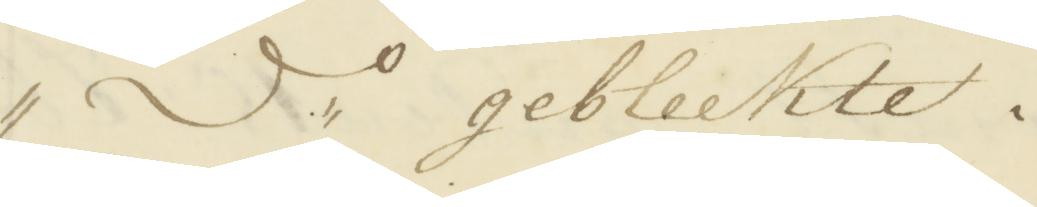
1„ D„o gebleekte.
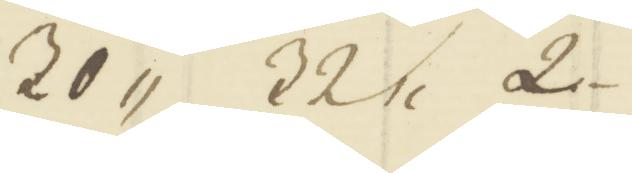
30 „ 32„ 2.
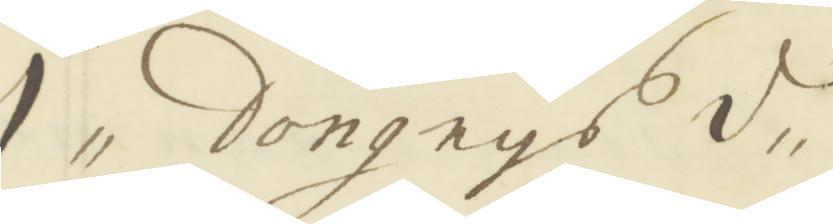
1 „ Dongrijs d„o
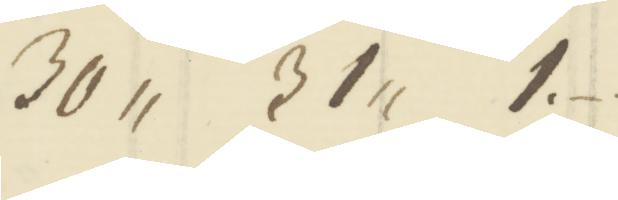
30 „ 31„ 1.
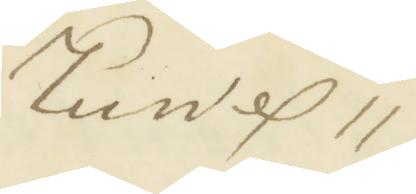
ruwe „
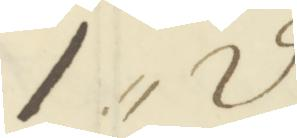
1„ D„o
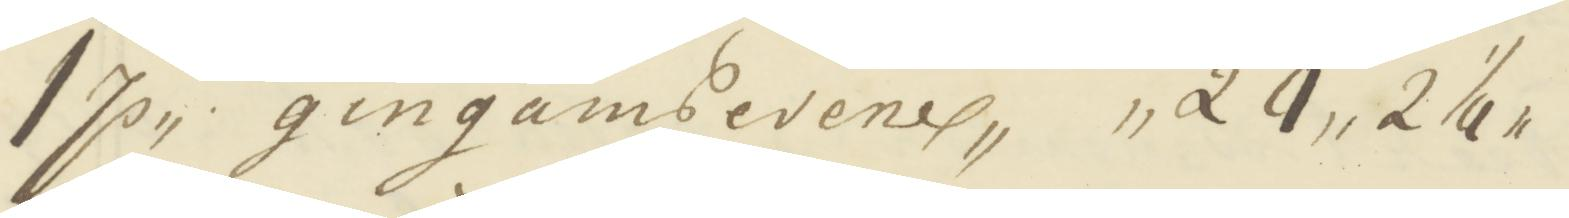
1 p„s gingams evene „ „24 „ 2¼ „}
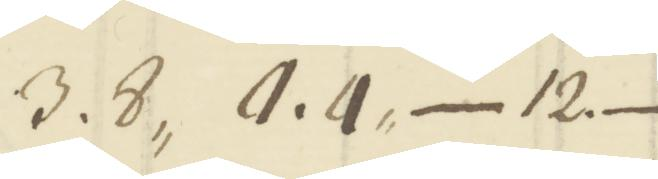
3.8„ 4.4„—12.-
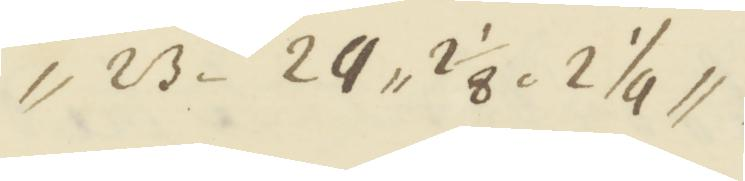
„ 23 „ 24 „ 2 1/8 2¼ „}
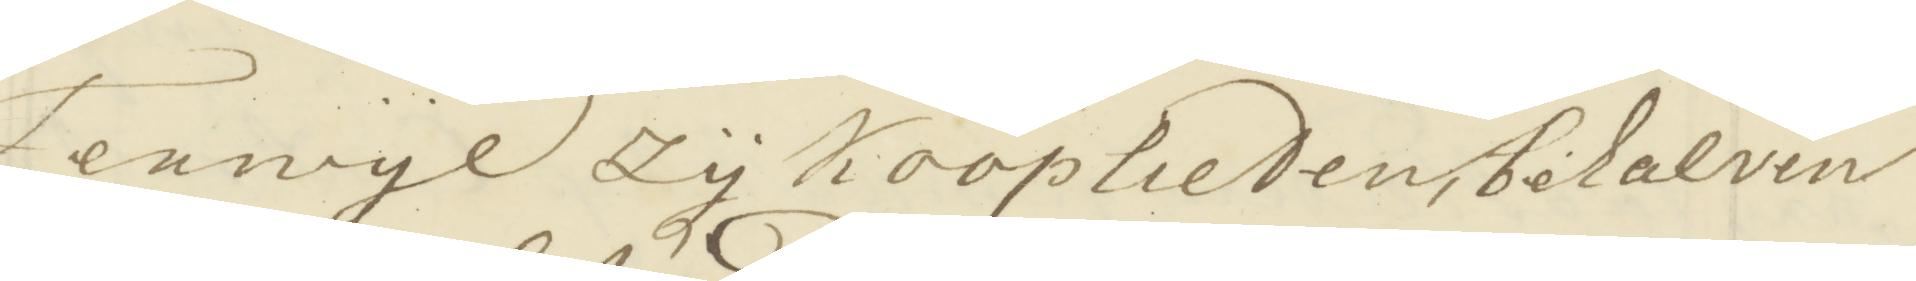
Terwijl zij kooplieden, behalven
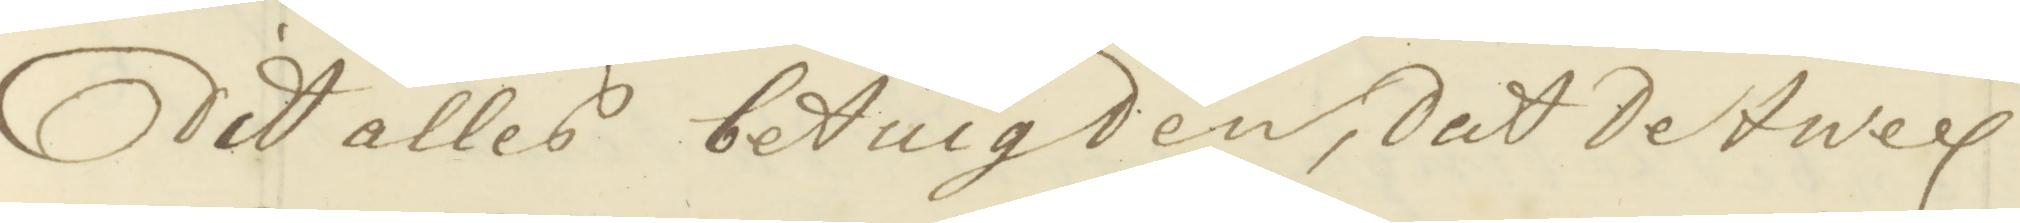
dit alles betuigden, dat de twee
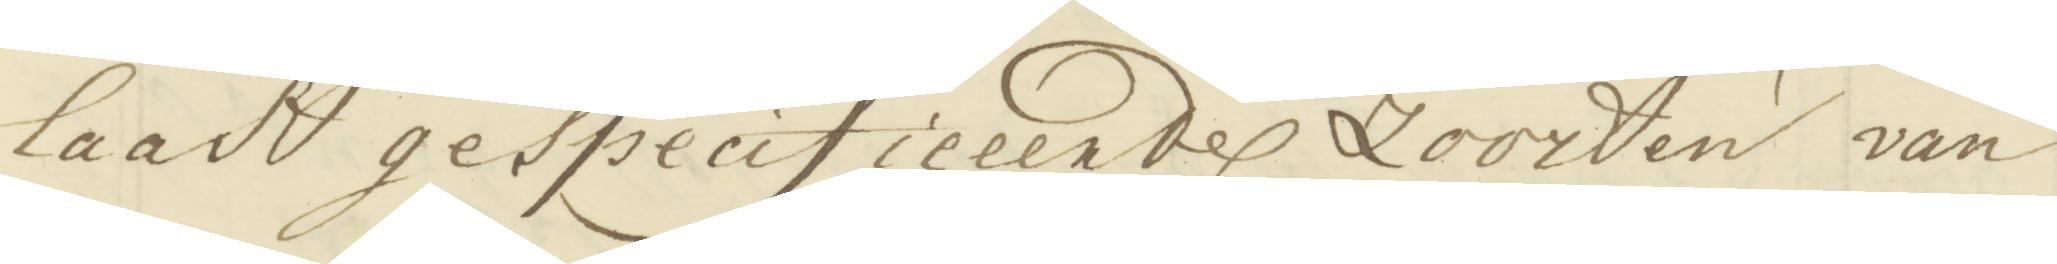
laast gespecificeerde Zoorden van
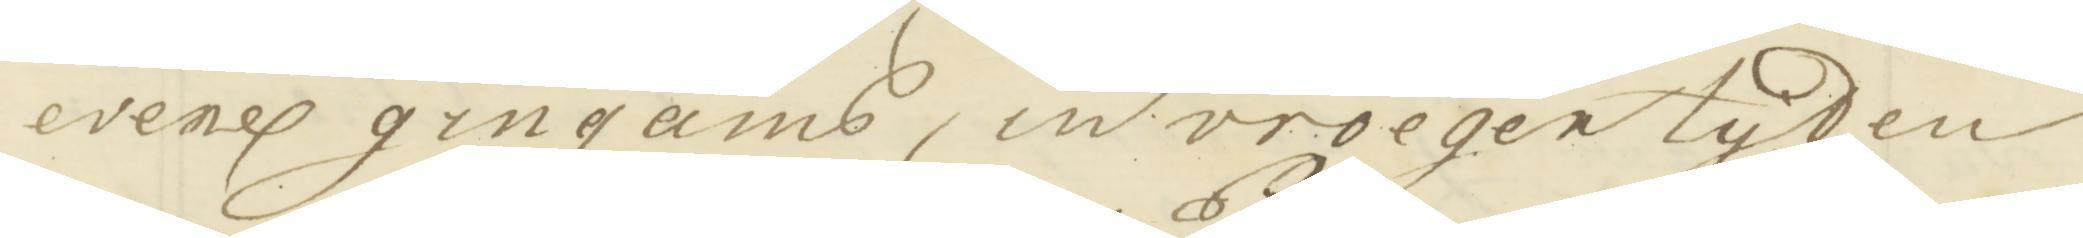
evene gingams, in vroeger tijden
